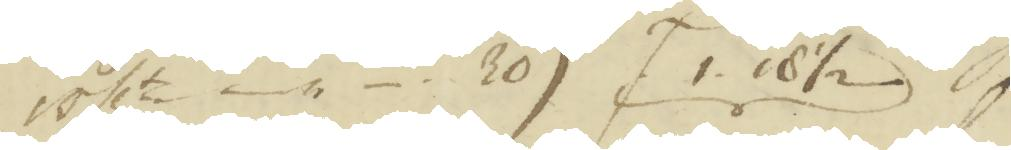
10 /c=t — „ — . 30 ƒ 1. 18½
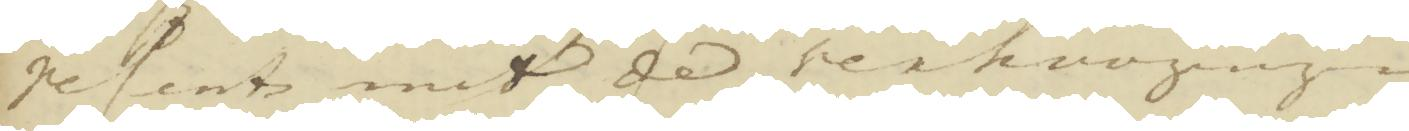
ve Cent met de verhoogingen
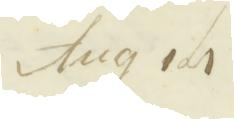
Aug 14
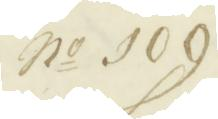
N=o 109
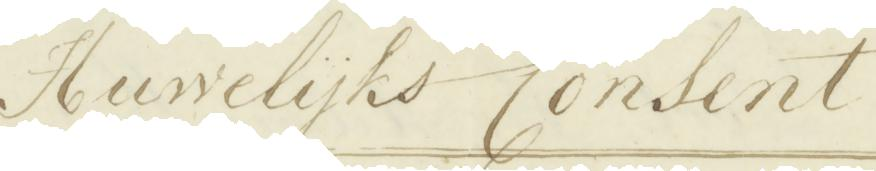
Huwelijks Consent
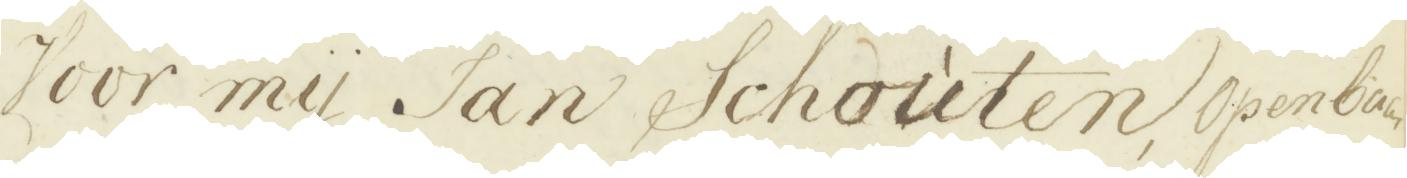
Voor mij Jan Schouten, openbaar
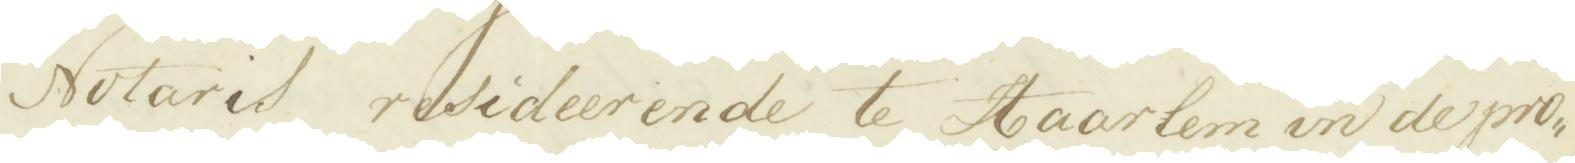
Notaris resideerende te Haarlem in de pro„
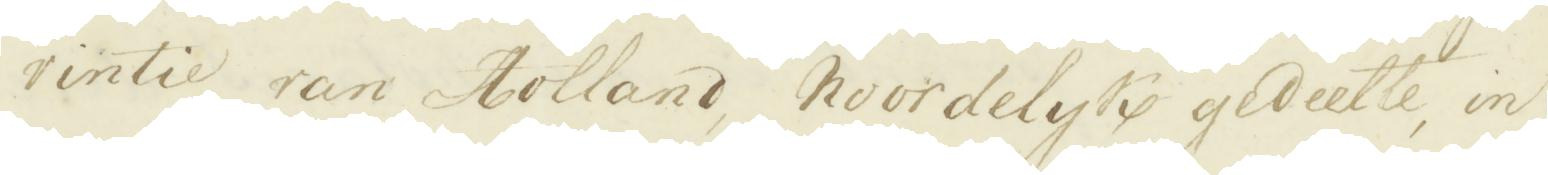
vintie van Holland, Noordelyk gedeelte, in
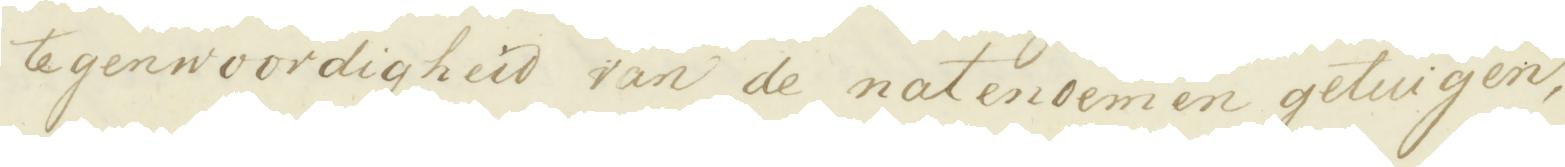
tegenwoordigheid van de natenoemen getuigen,
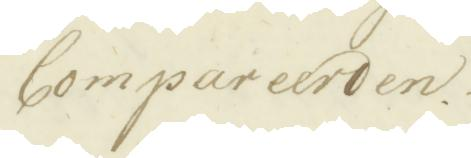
Compareerden.
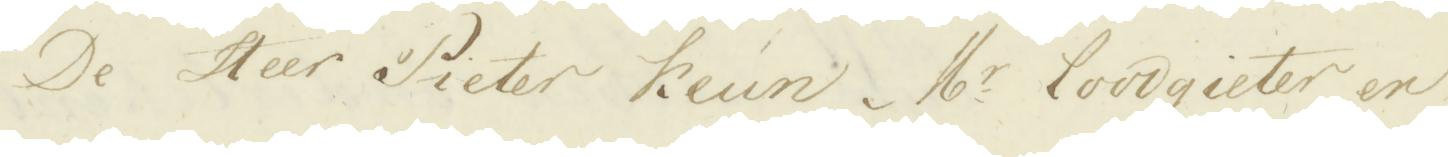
De Heer Pieter Keun, M=r loodgieter en
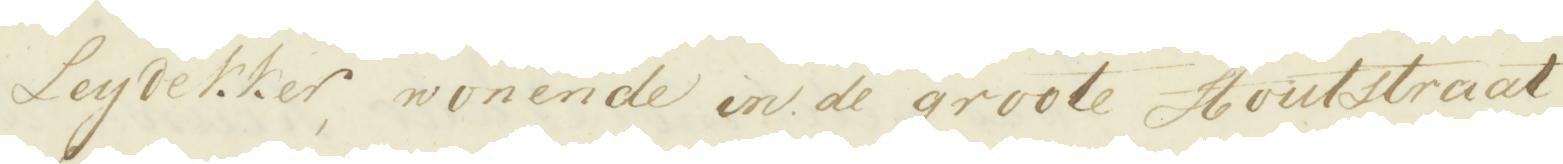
Leydekker, wonende in de groote Houtstraat
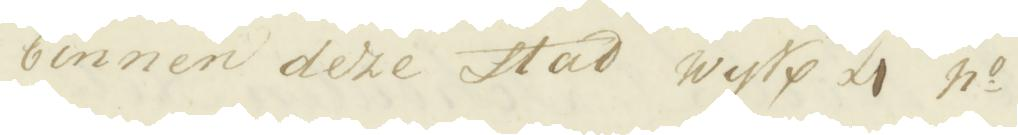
binnen deze stad wyk 4 n=o
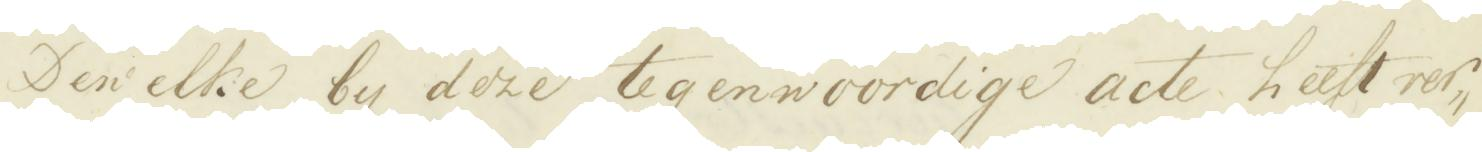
Dewelke bij deze tegenwoordige acte heeft ver„
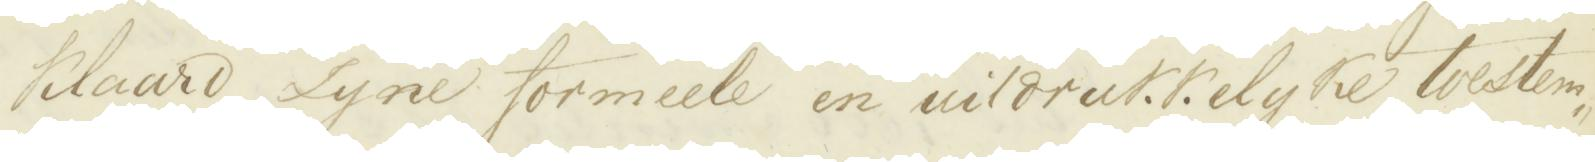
klaard zyne formeele en uitdrukkelyke toestem„
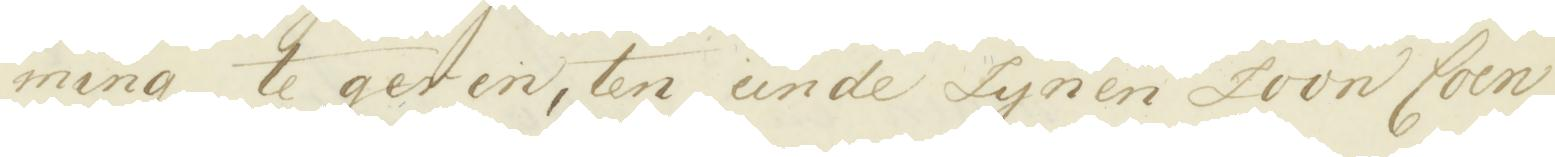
ming te geven, ten einde zynen zoon Coen
